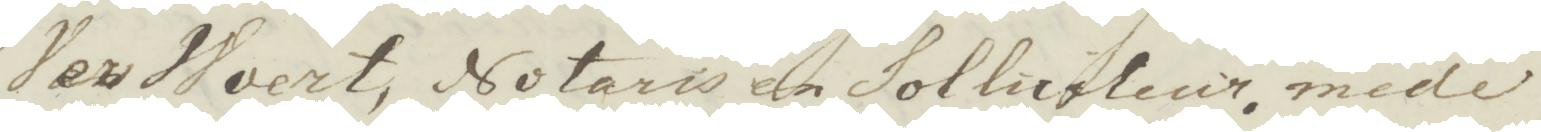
Ver Woert, Notaris en solliciteur, mede
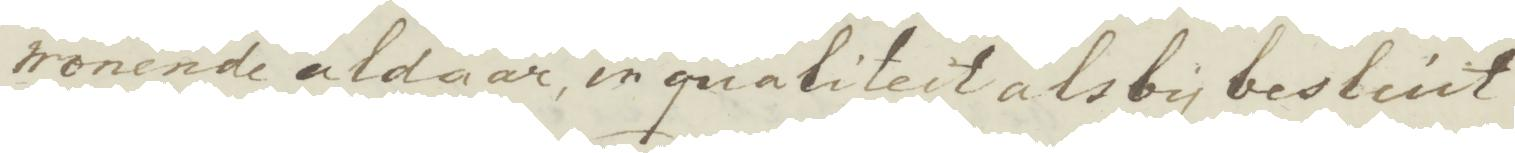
wonende aldaar, in qualiteit als bij besluit
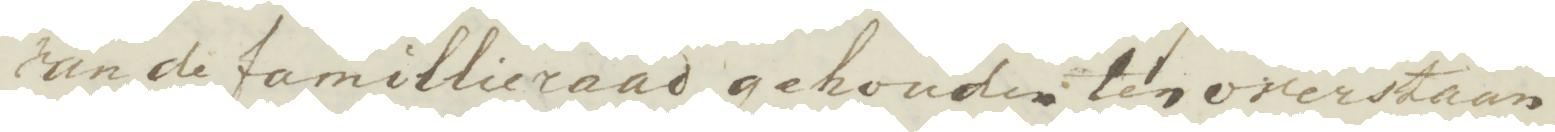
van de famillieraad, gehouden ten overstaan
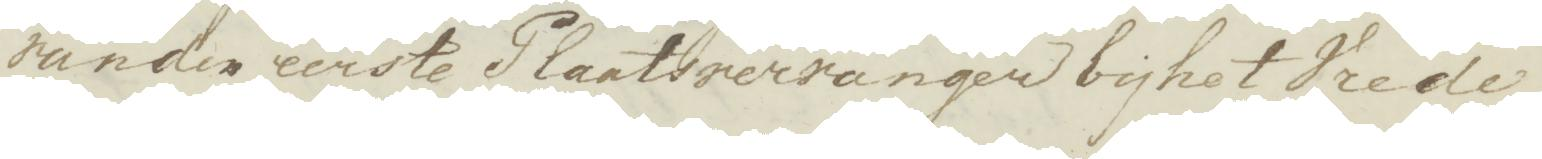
van den eerste Plaatsvervanger bij het Vrede
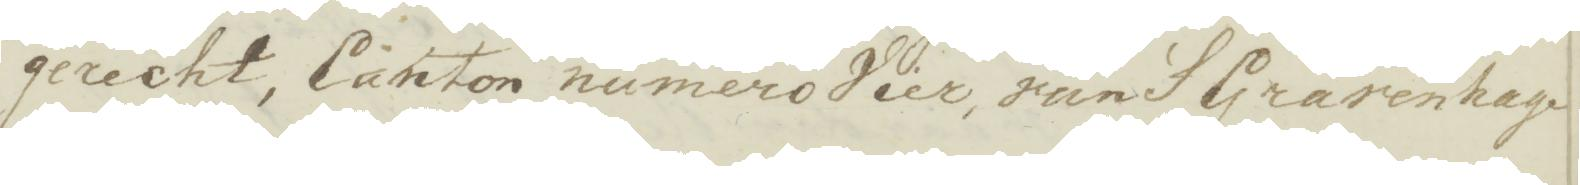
gerecht, Canton numero Vier, van 'S Gravenhage
